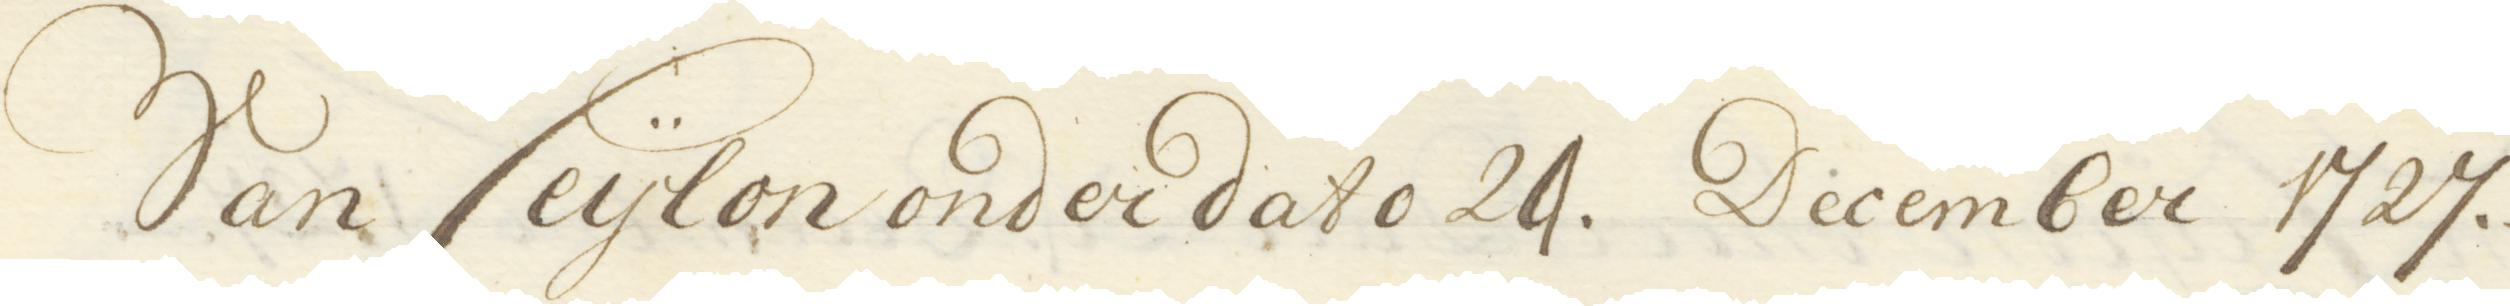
Van Ceijlon onder dato 24. December 1727.
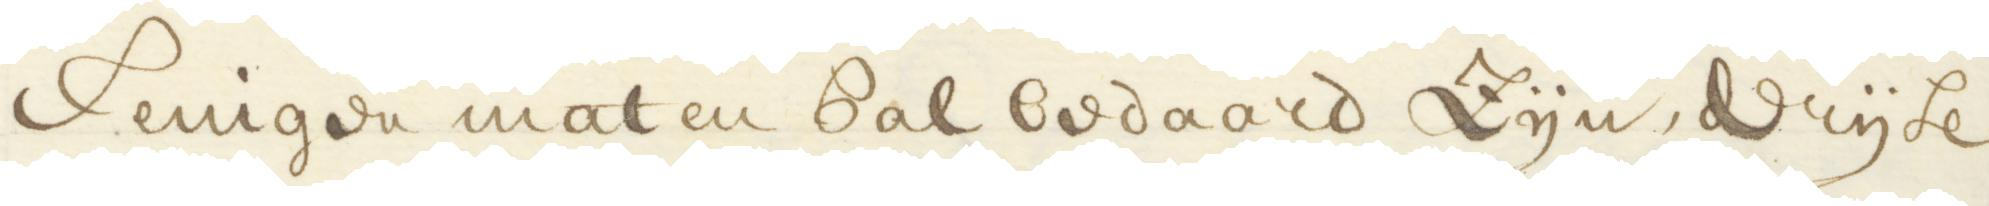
Eeniger maten bal bedaard zijn, de rijse
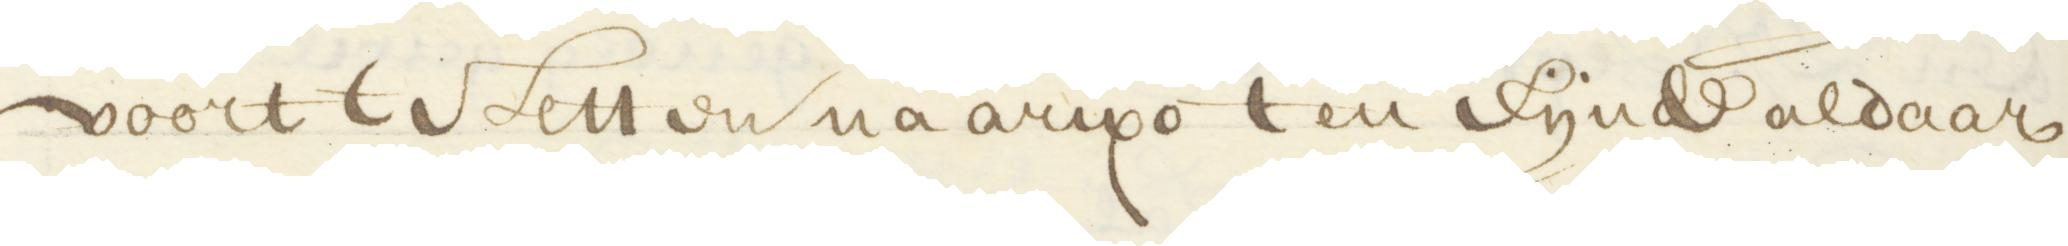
voort te setten naaripo ten Eijnde aldaar
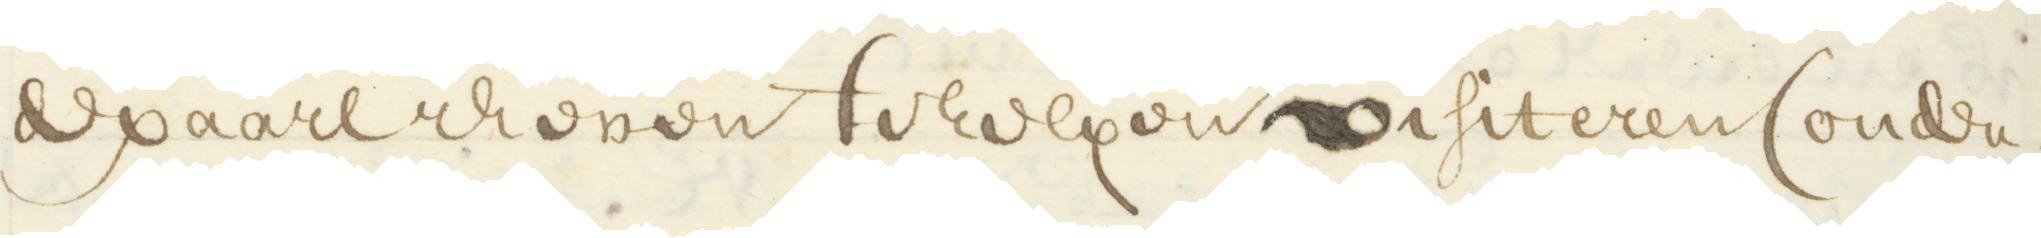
de paarlrheven te helpen visiteren (onder„
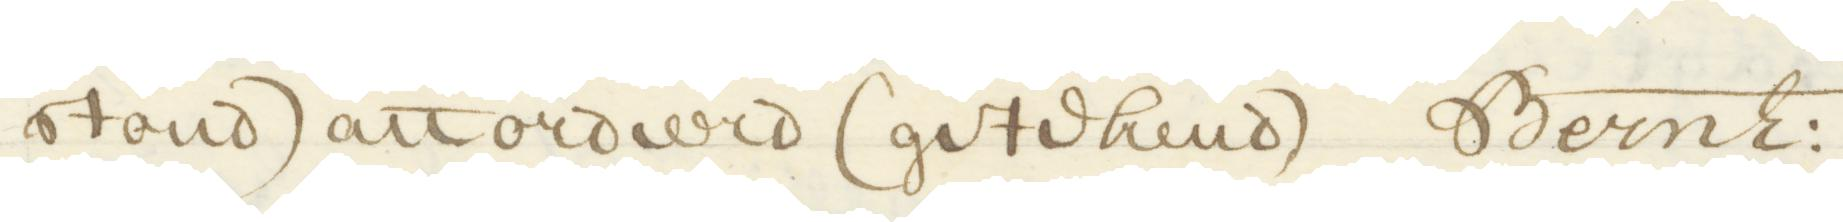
stond) accordeerd (getekend) Bernh:
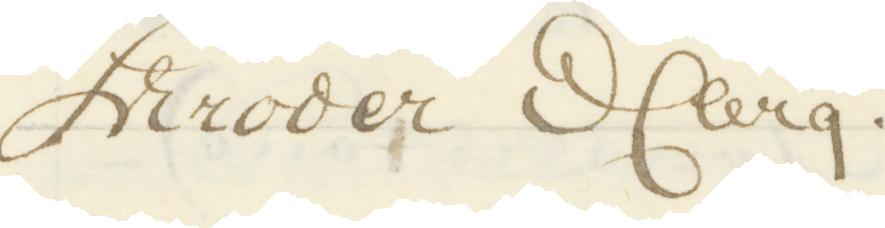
schroder EClerq.
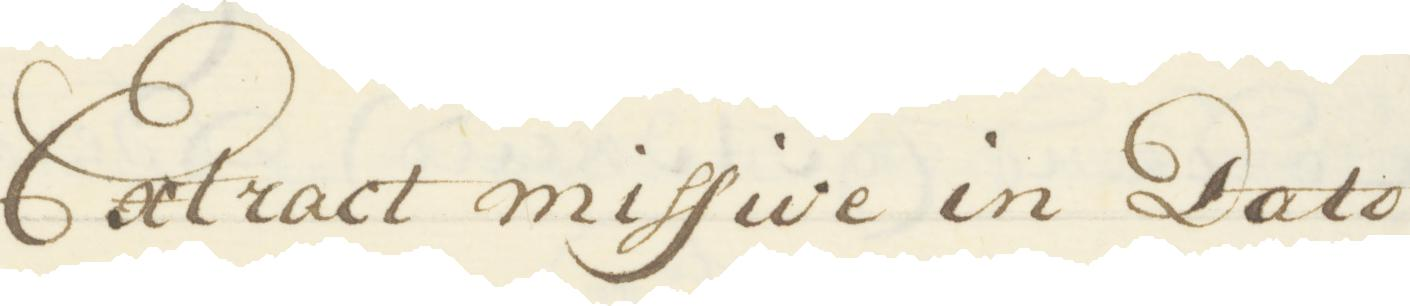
Extract missive in Dato
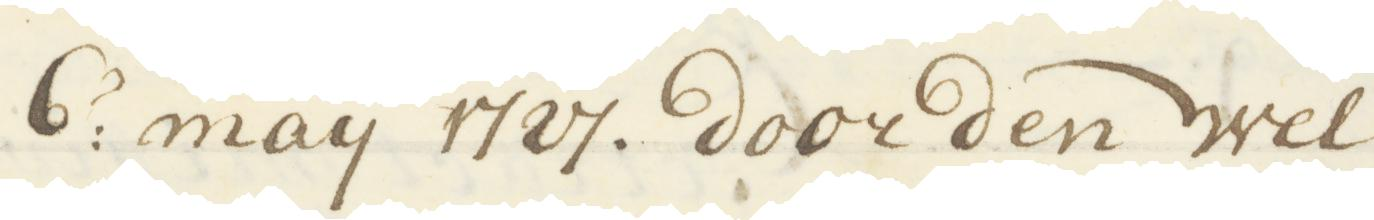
6:' maij 1727. door den wel
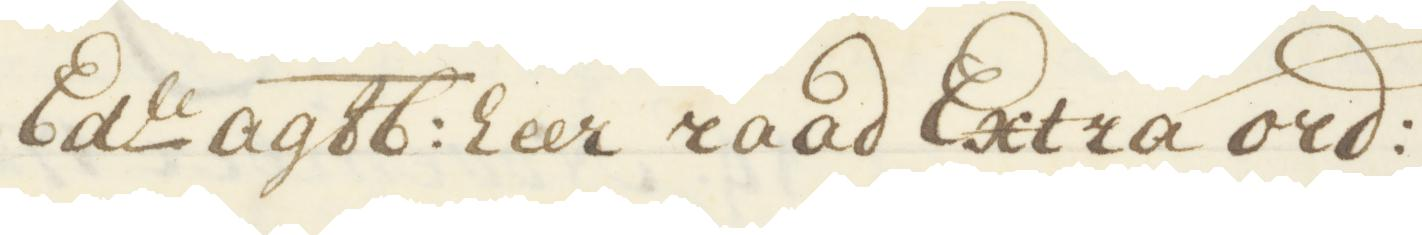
Ed=le agtb: heer raad Extra ord:
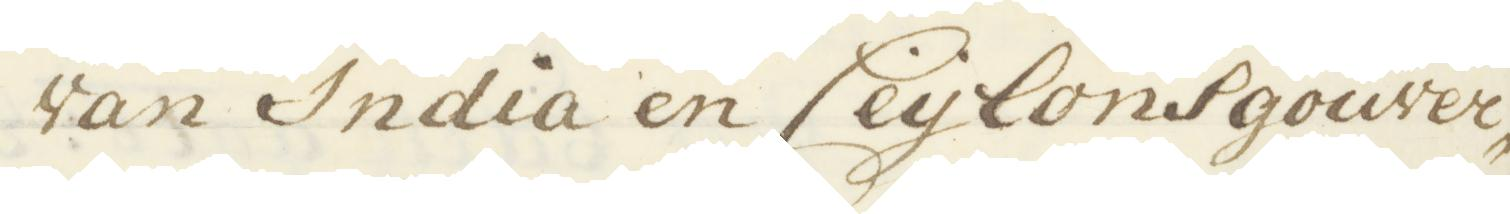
van India en Ceijlons gouver„
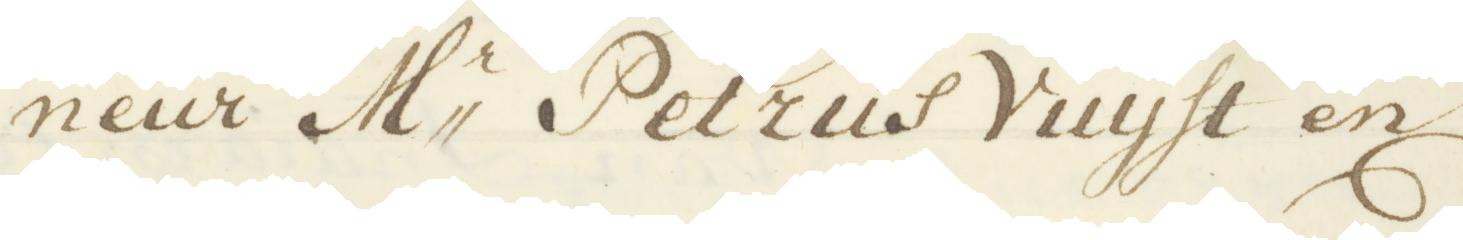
neur M„r Petrus Vuijst en
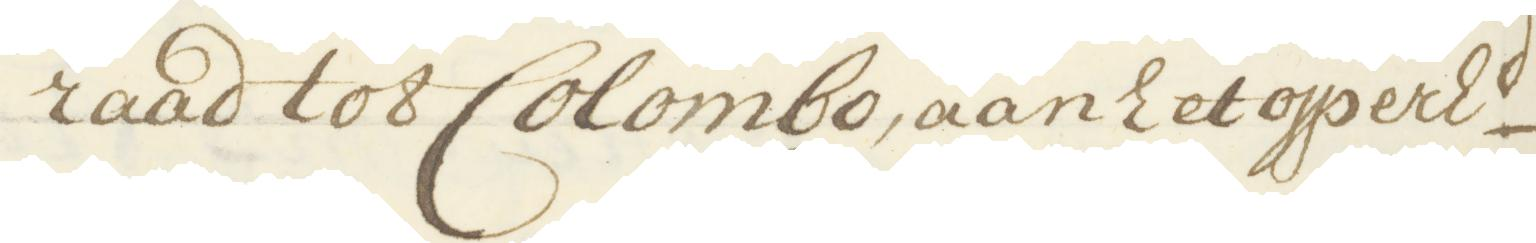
raad tot Colombo, aan het opperh=d
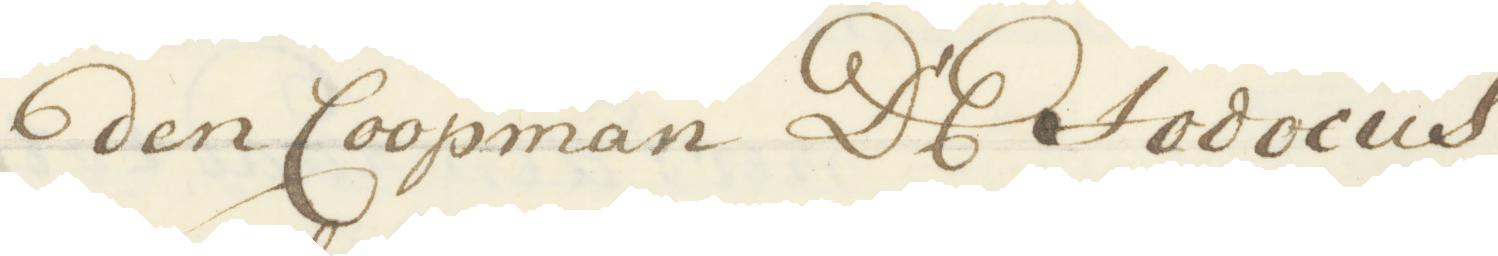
den Coopman DE Iodocus
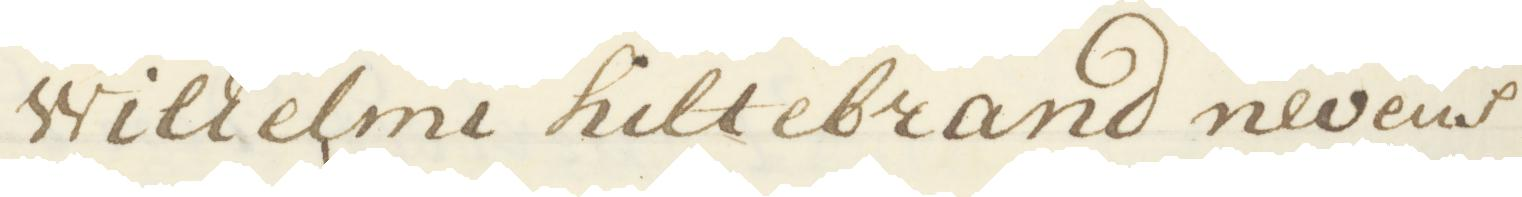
wilhelmi hiltebrand nevens
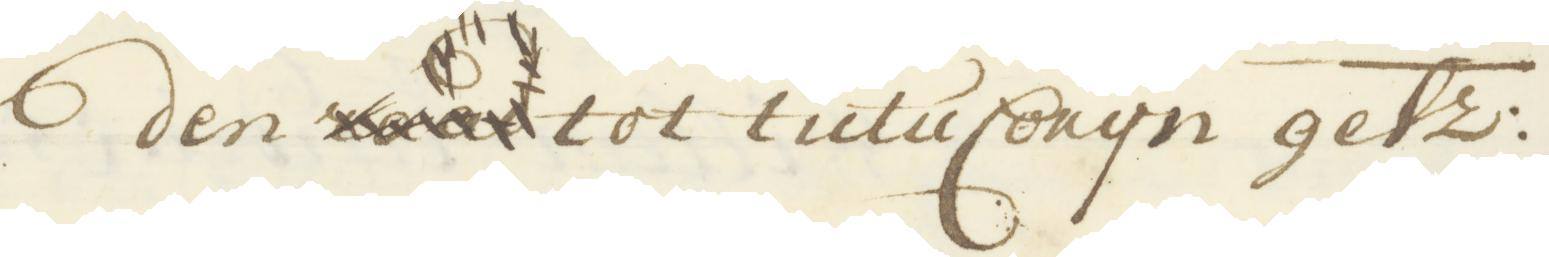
den raad tot tutucorijn gesz:
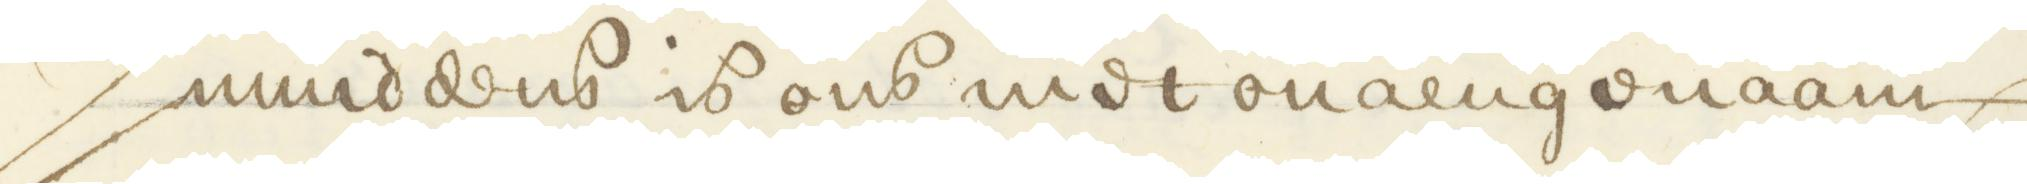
Jnmiddens is ons niet onaengenaam
